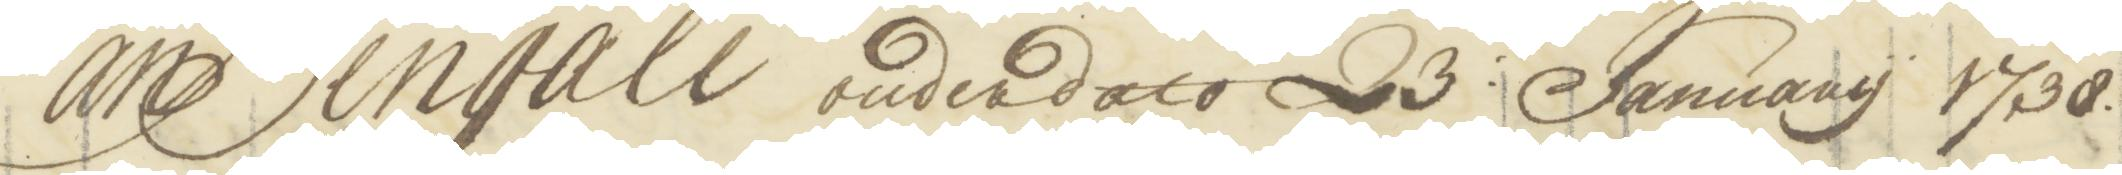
Van Bengale onder dato 23:' Januarij 1738.
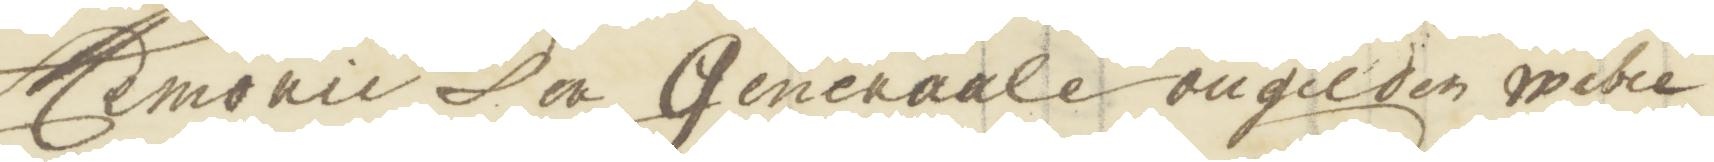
Memorie Der Generaale ongelden weke
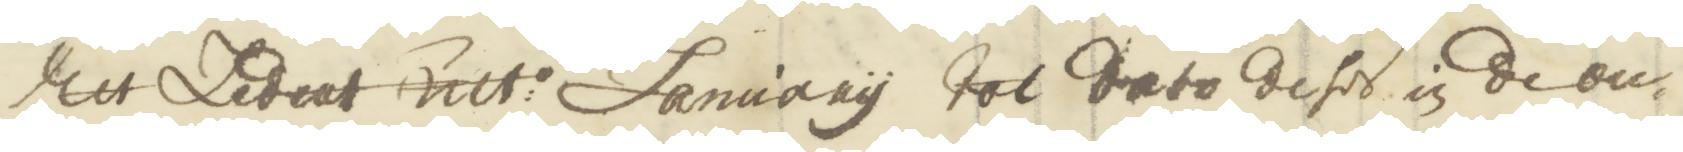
het zedert ult:o Januarij tot dato deses in de on„
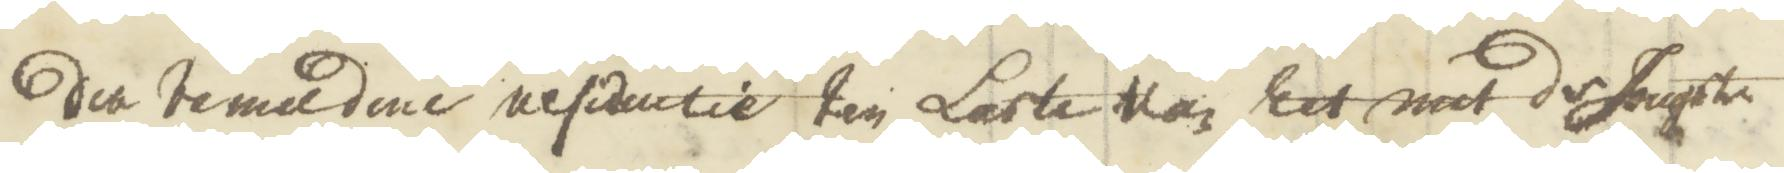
der temeldene residentie ten Laste van het met de Jongst:
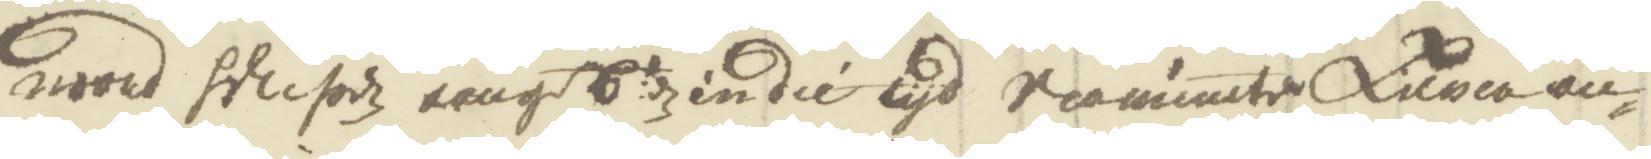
noord schepen range b=t en in die tijd vermunte Zilver en„
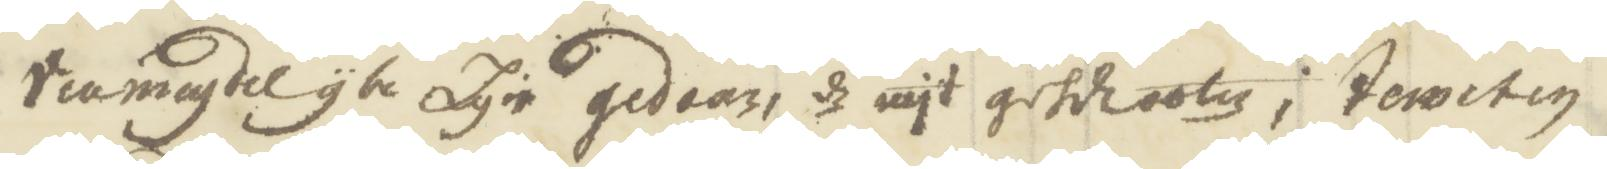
vermeydelijk zyn gedaan, en uijt geschooten; teweten
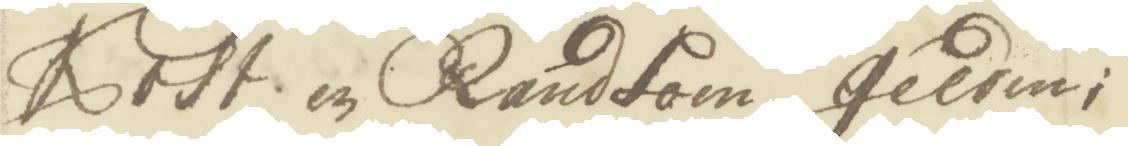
Kost en Randsoen gelden;
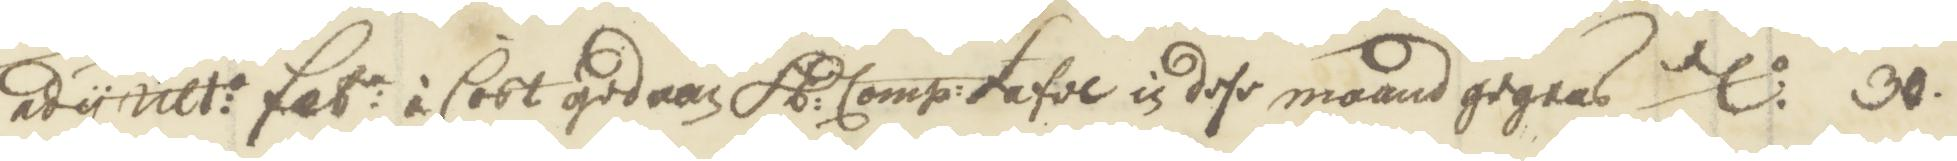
adij ult:o feb:r à Cost gedaan SE: Comp: tafel in dese maand gegras r:o 30.
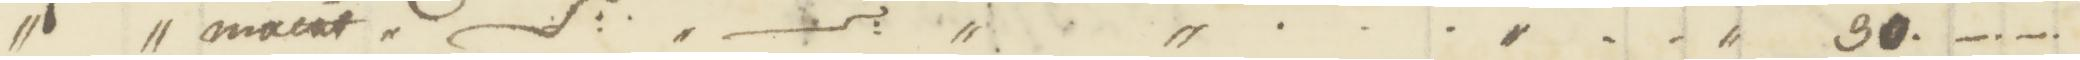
„ „ maert „ _:o „ _:o „ . „ . . . „ . . „ 30.–.–.
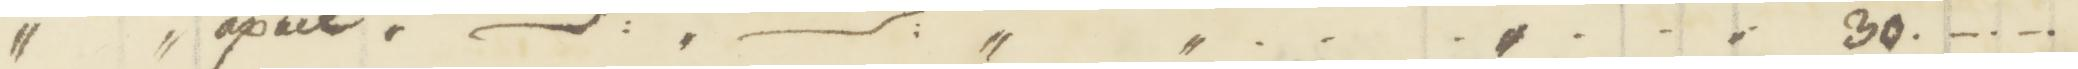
„ „ april d. „ _:o „ „ . . . „ . . „ 30.–.–.
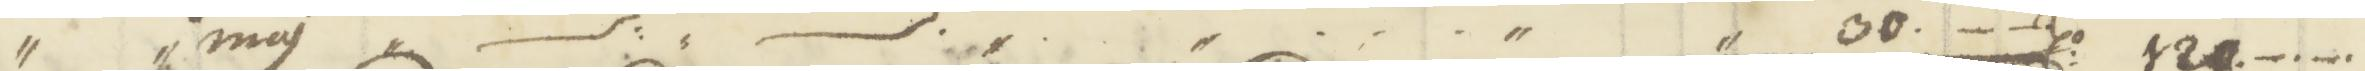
„ „ meij „ _:o „ _.o „ . . . „ . . . „ „ 30. – – r:o 120.–.–.
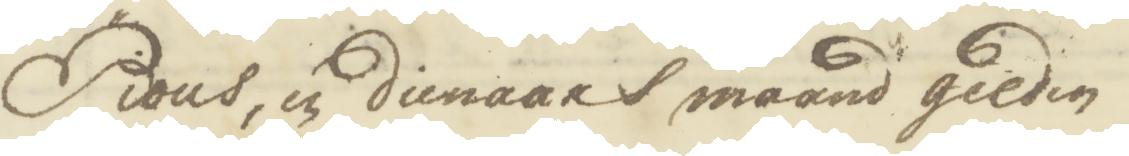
Pions, en dienaars maand gelden
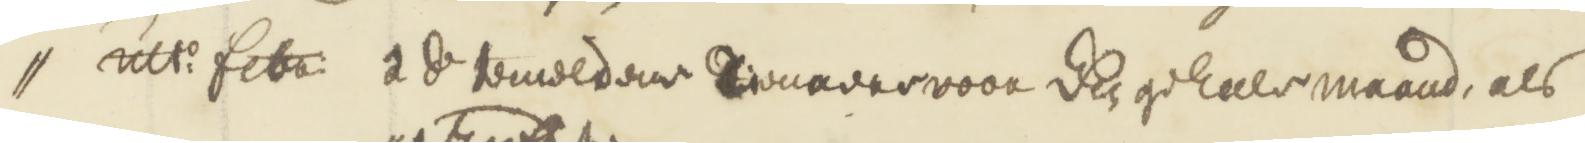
„ ult:o febr: 2 de temeldene dienaere voor Een geheele maand, als
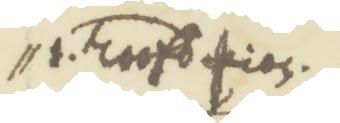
„1. hoofd pion .
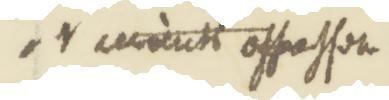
„ 1 munts oppasser
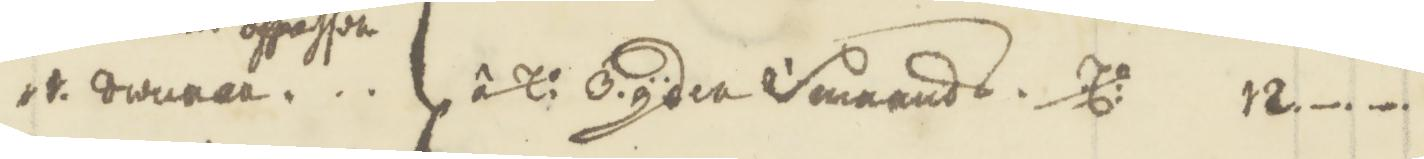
„1. dienaar . . . â r:o 3. ijder 'Smaands . r:o 12.–.–.
